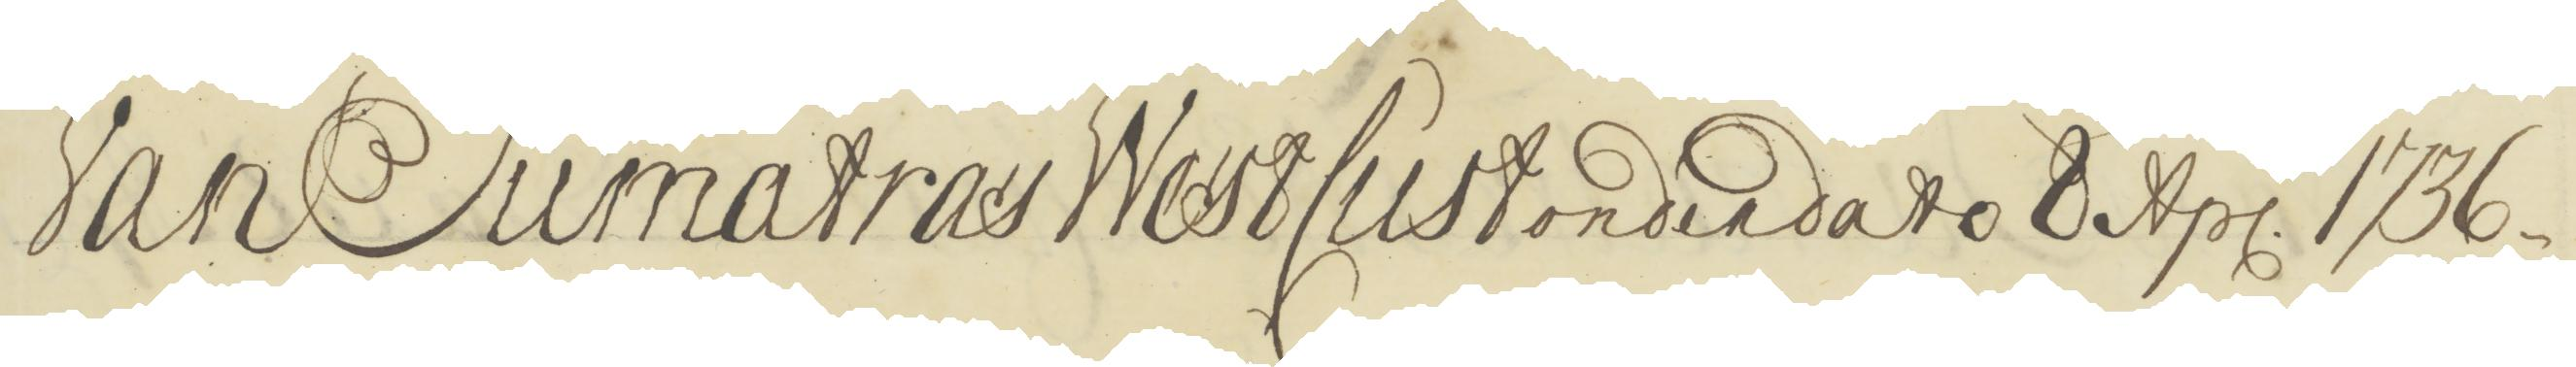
Van Sumatras West Cust onder dato 8 Ap. 1736-
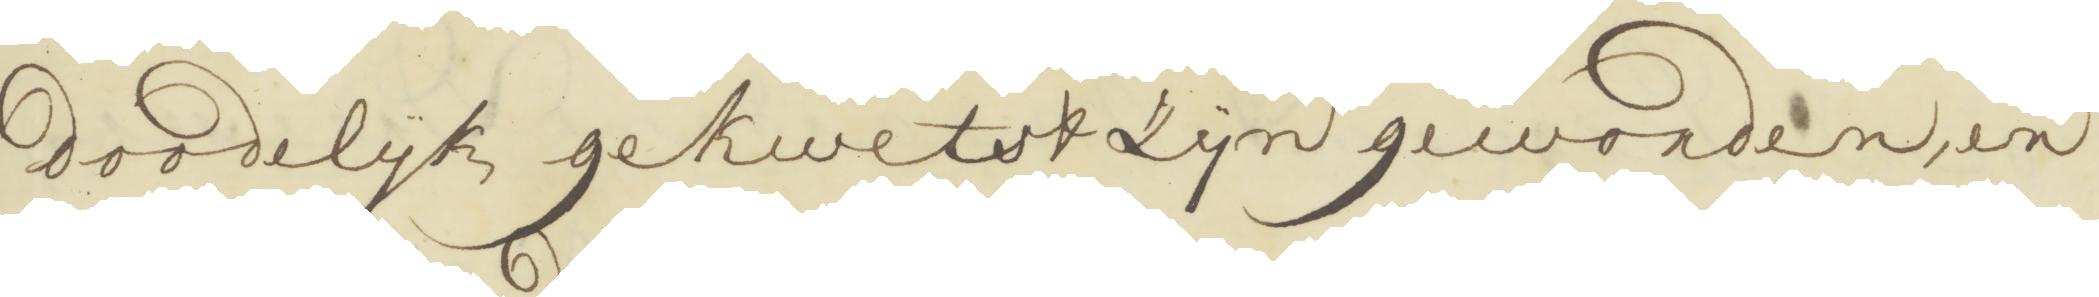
doodelijk gekwetst zijn geworden, en
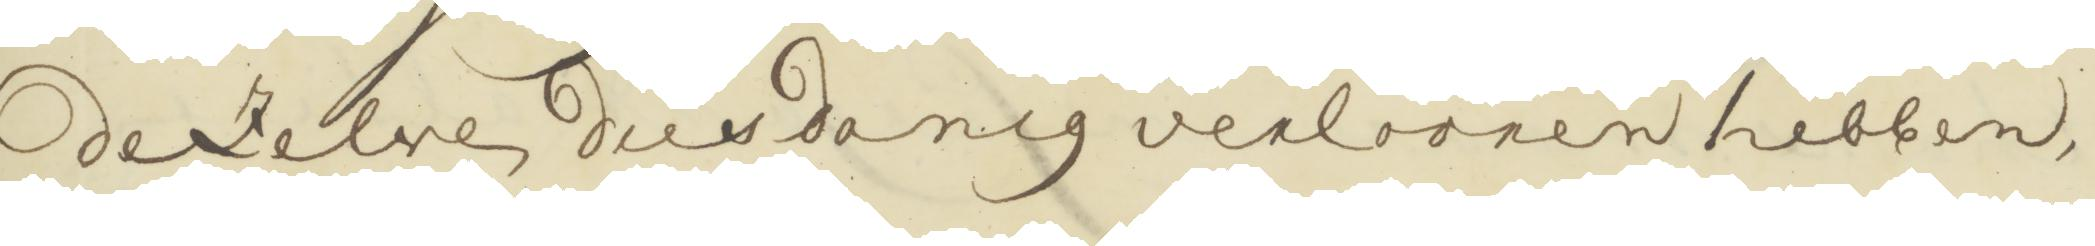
de zelven dus danig verlooren hebben,
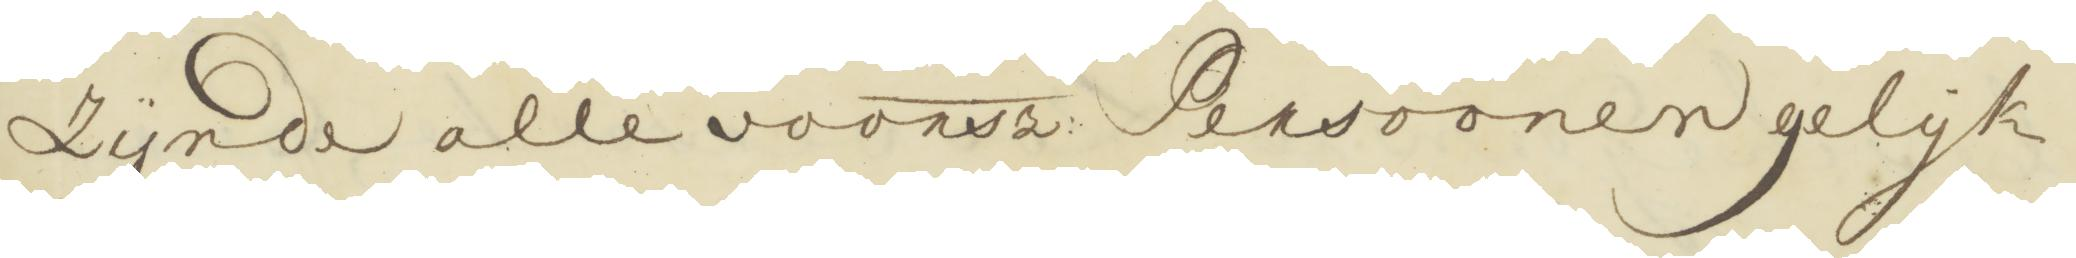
zijnde alle voorsz: Persoonen gelijk
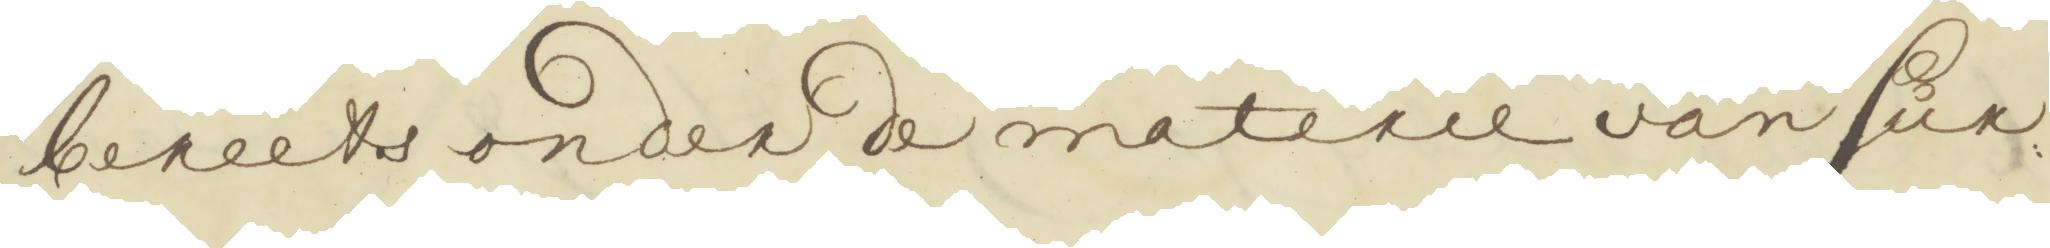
bereets onder de materie van Sur„
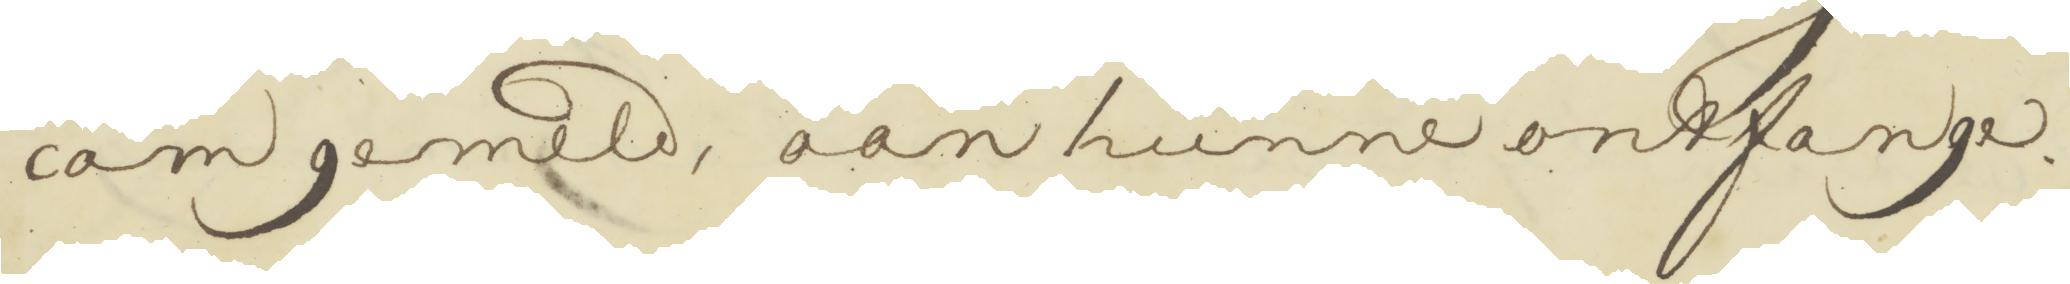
cam gemeld, aan hunne ontfange.
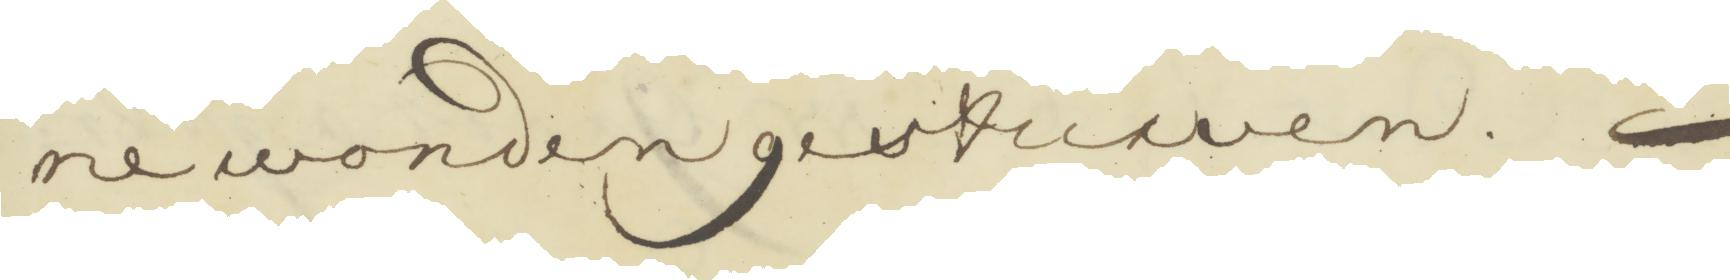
ne wonden gesturven.-
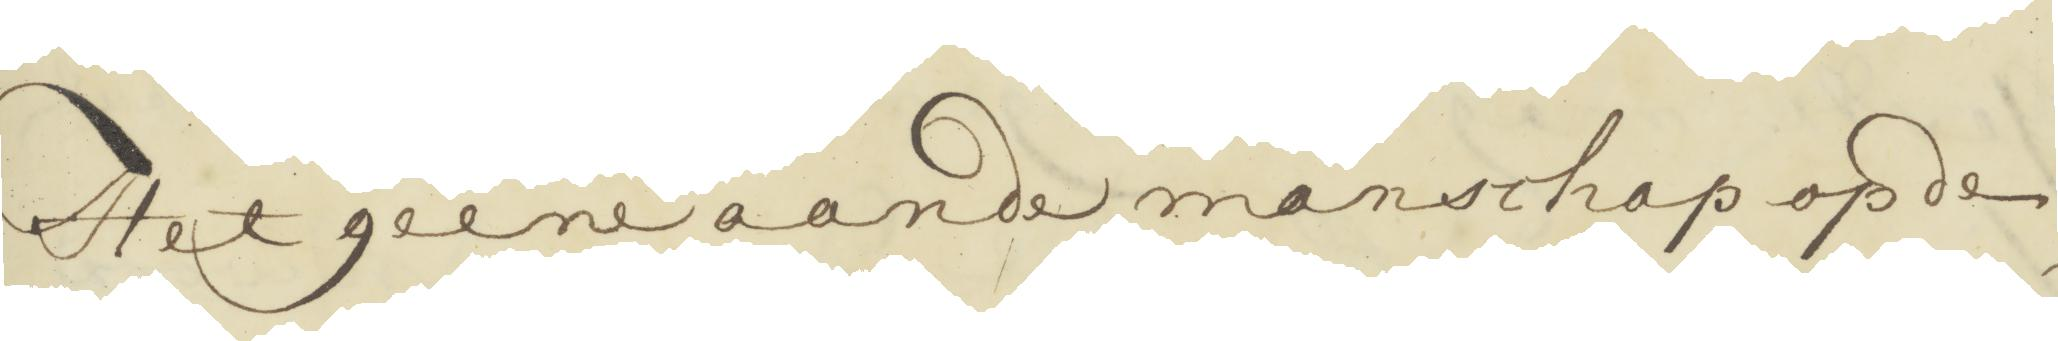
Het geene aande manschap op de
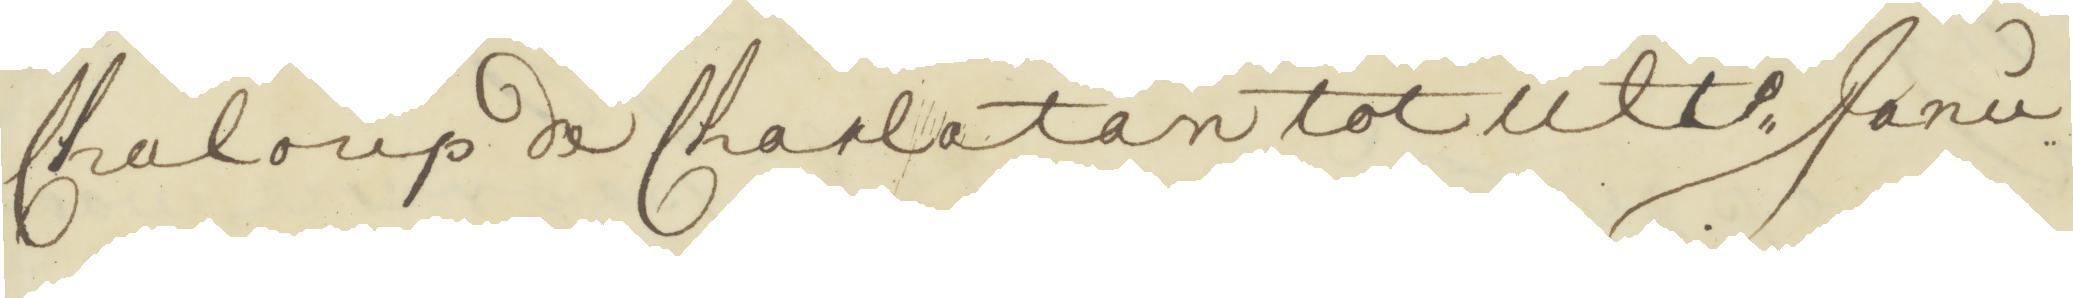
Chaloup de Charlatan tot ult„o Janu„
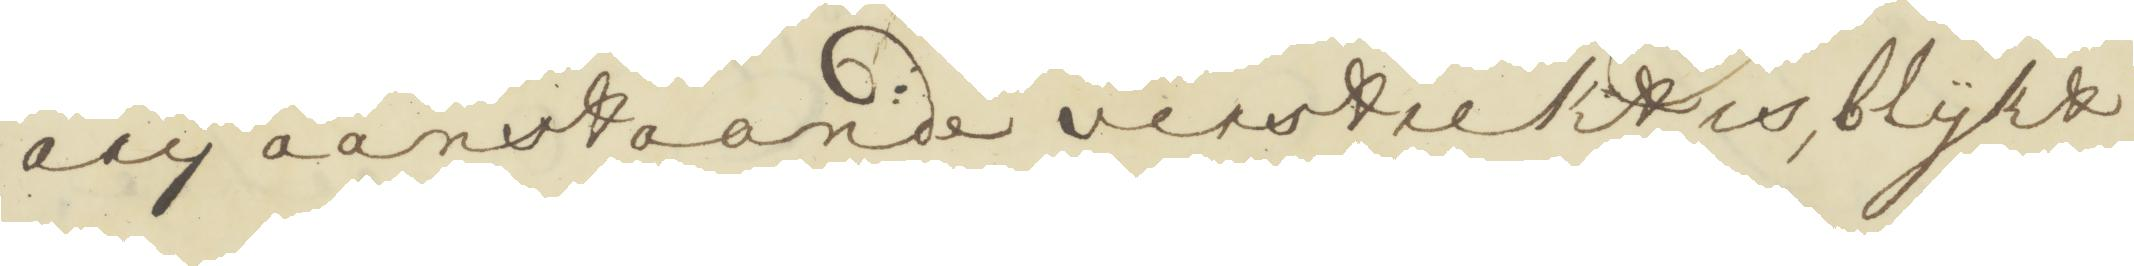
arij aanstaande verstrekt is, blijkt
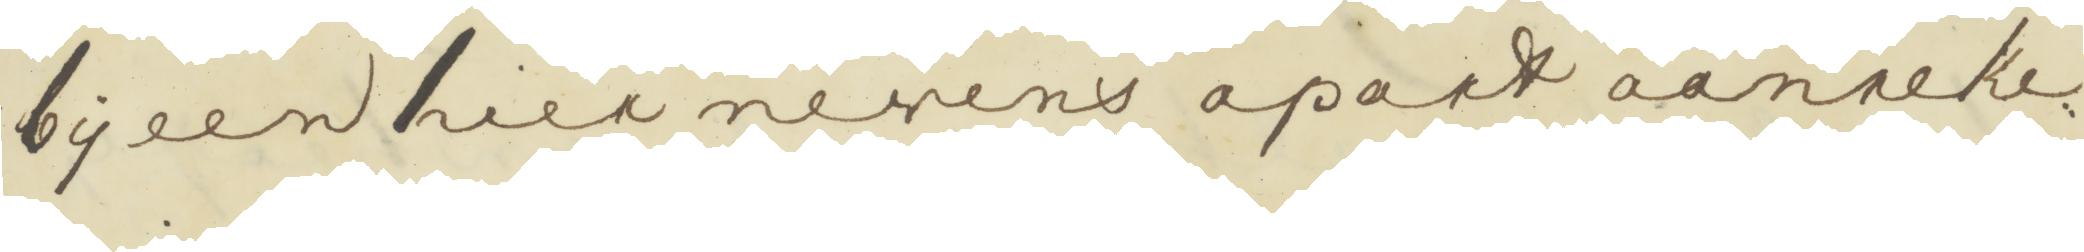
bij een hier nevens apart aanreke„
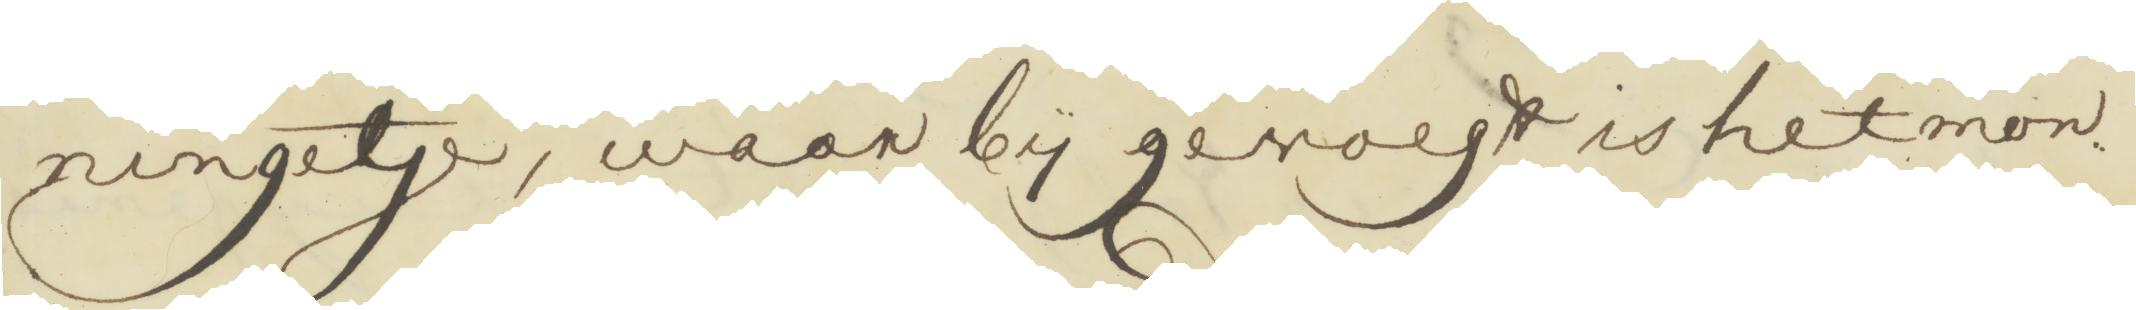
ningetje, waar bij genoegt is het mon„
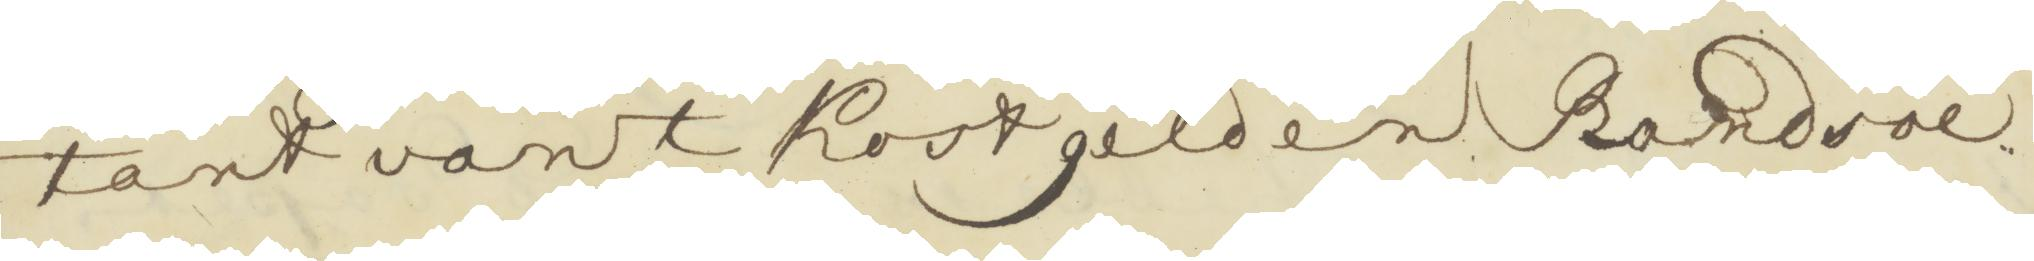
tant van ’t Kostgeld en Raendsoe„
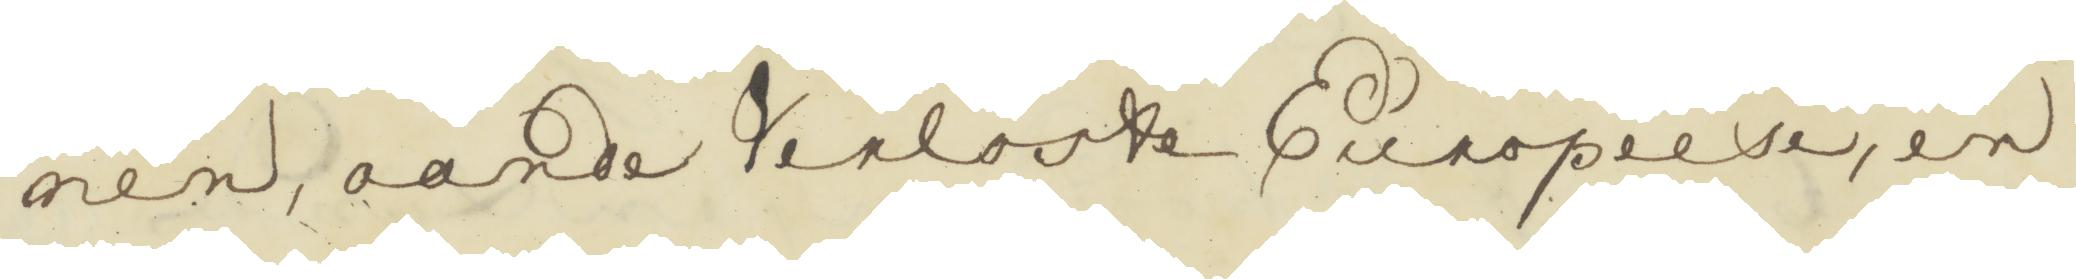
nen, aande verloste Europeese, en
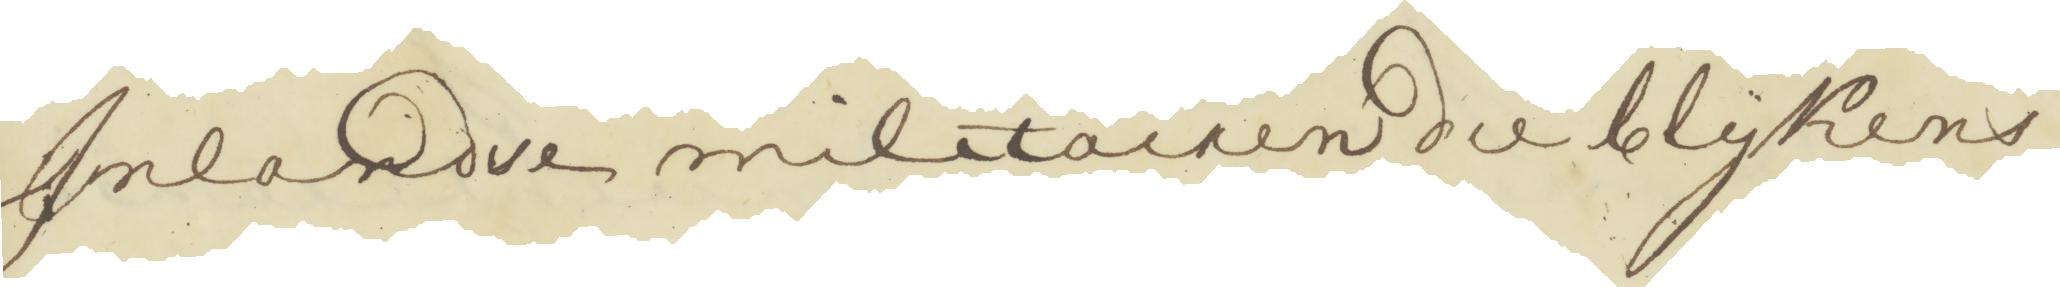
Jnlandse militairen die blijkens
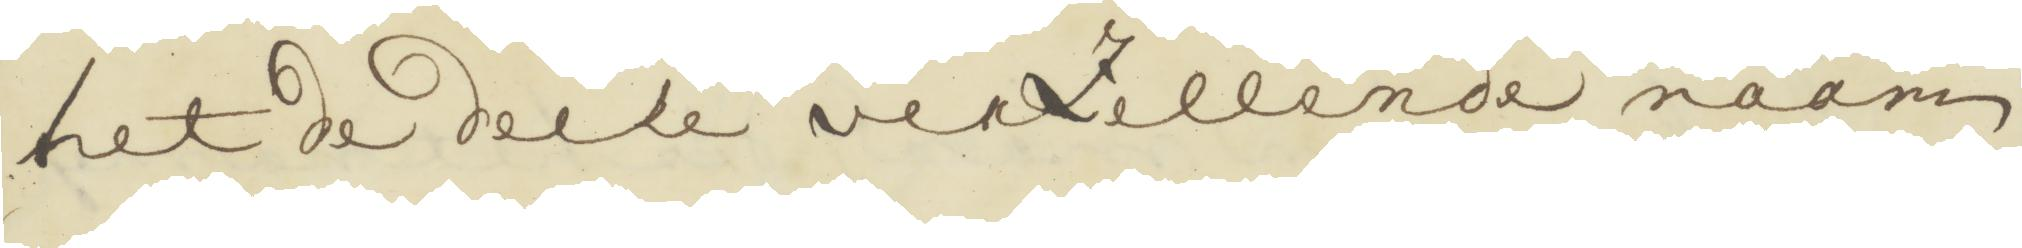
het de deeze verZellende naam
